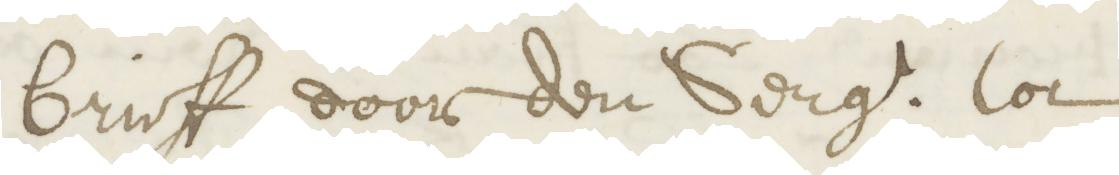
brieff door den serg.t tot
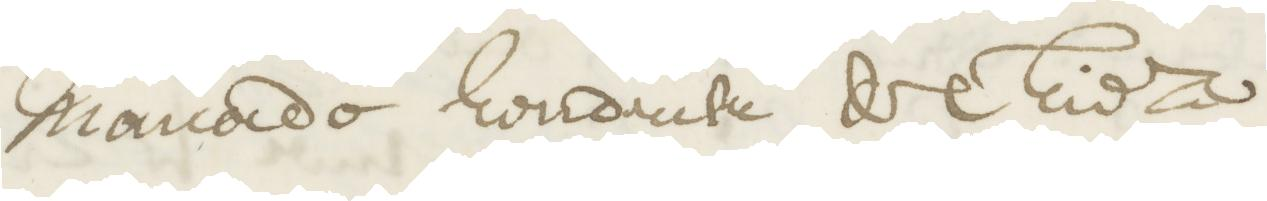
Manado hendrik de Chieze
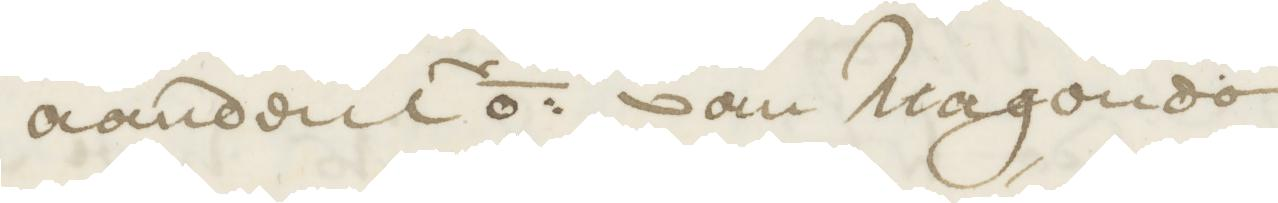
aan den Co: van Magondo
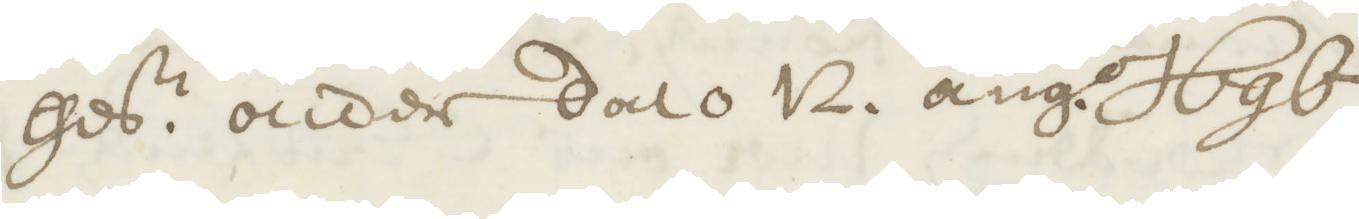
ges:t onder dato 12. aug.o 1696
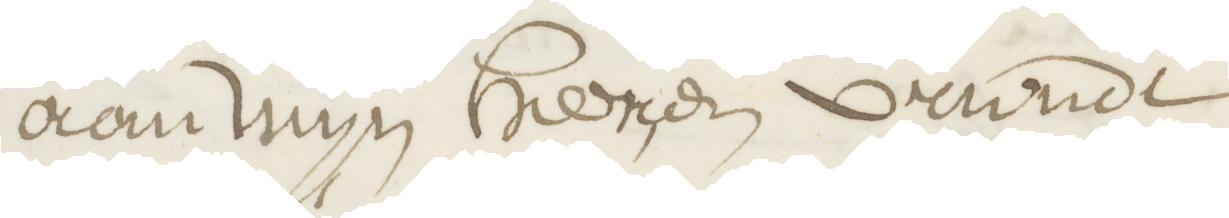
aan mijn Heeren vriendt
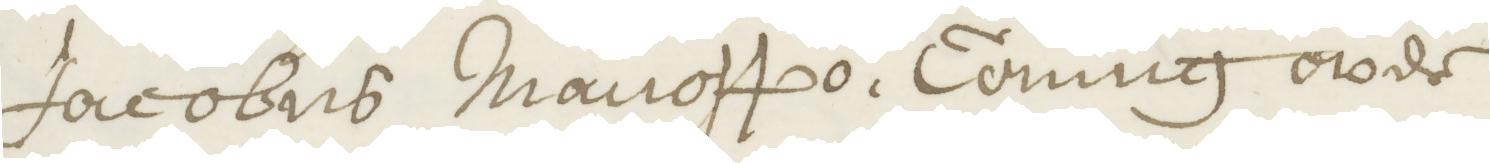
Jacobus Manoppo. Coning over
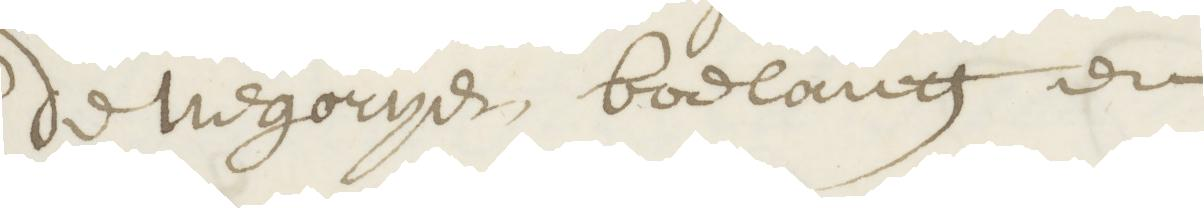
de negorijen boelang en
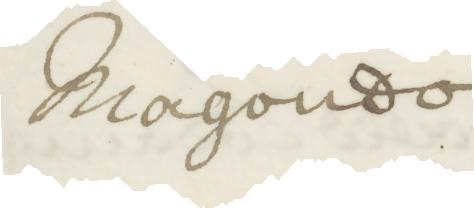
Magondo
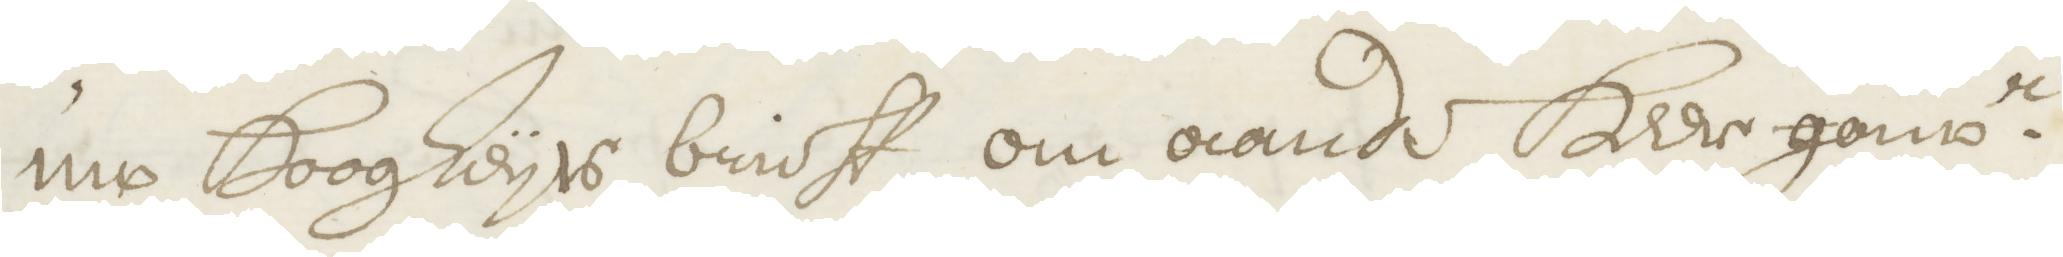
uw Hoogheijts brieff om aande Heer gouv:r
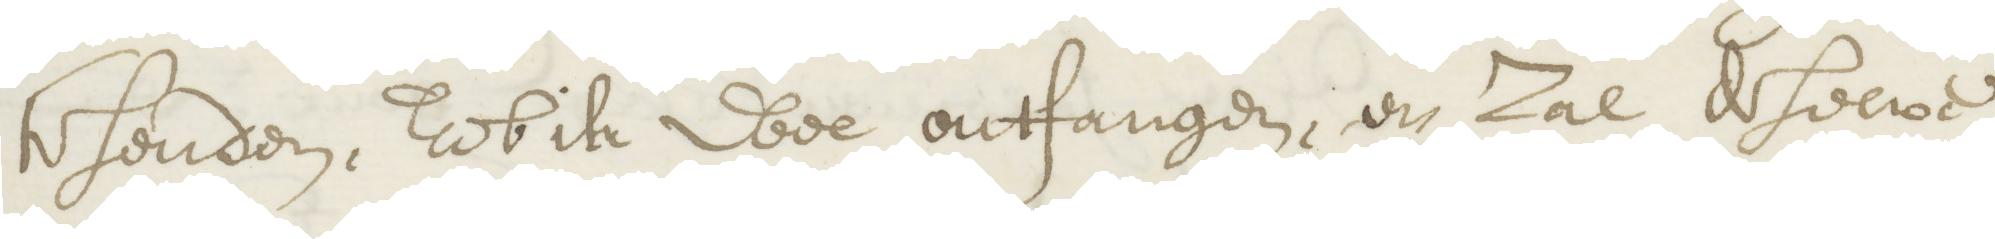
te senden, heb ik wel ontfangen, en zal deselve
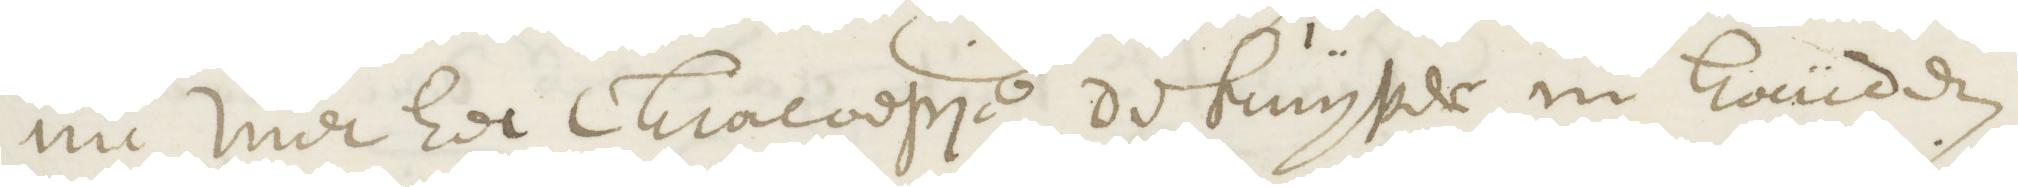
nu met het chialoepje de kuijper in handen
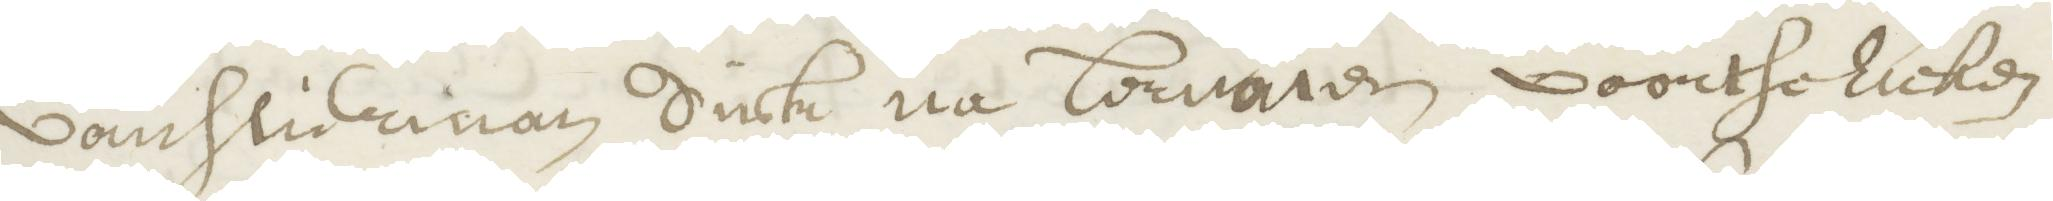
van stierman dusk na Ternaten voortschicken
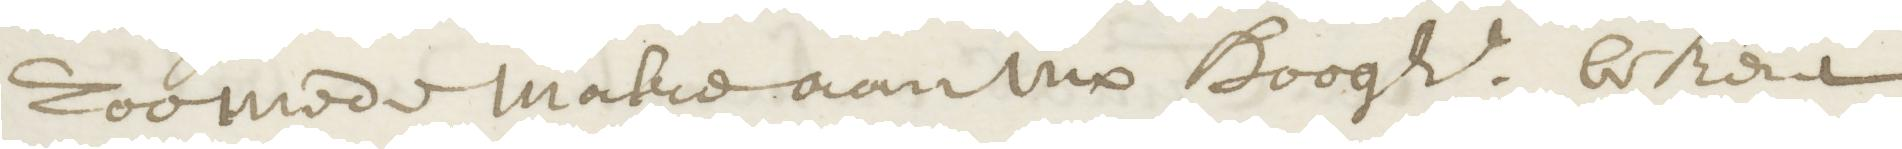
zoomede make aan uw Hoogh.t bekent
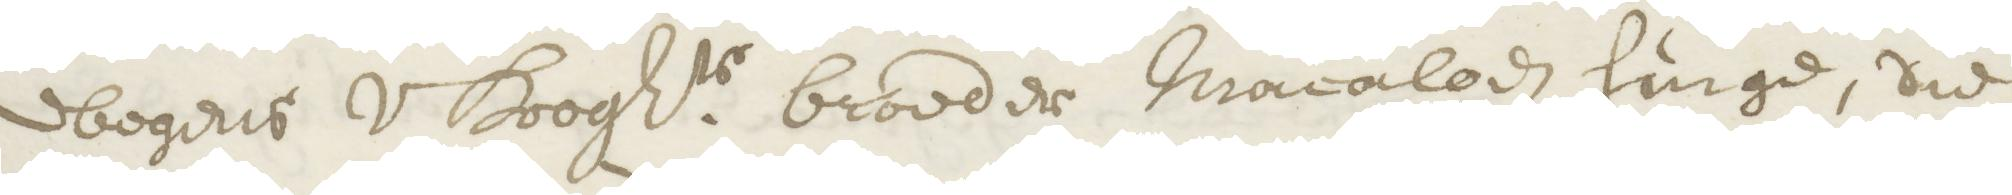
wegens V Hoogh.ts broeder macaloen singe, die
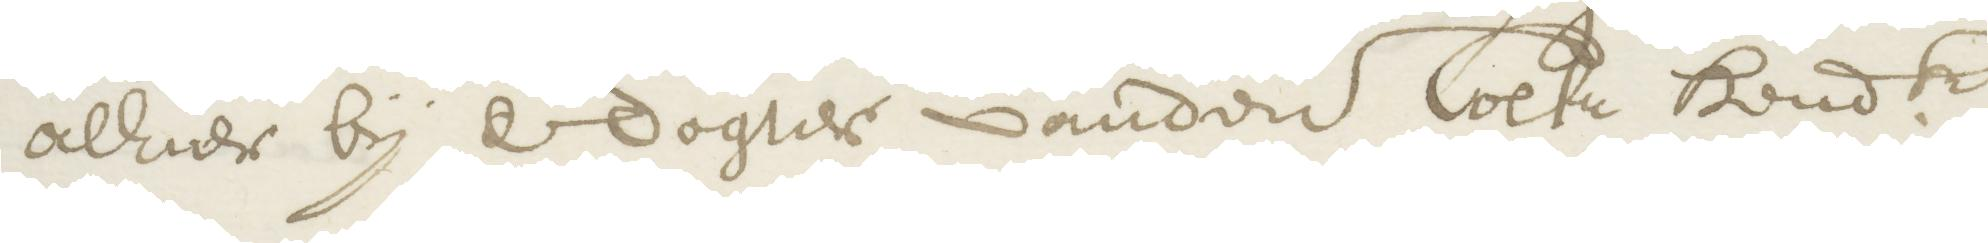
alhier bij de dogter vanden Tolk hend.k
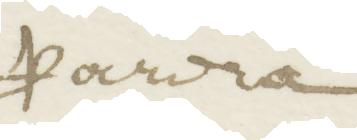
parera
